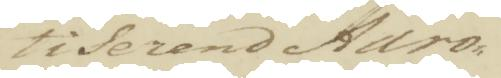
tiserend Advo„
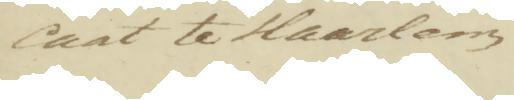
caat te Haarlem,
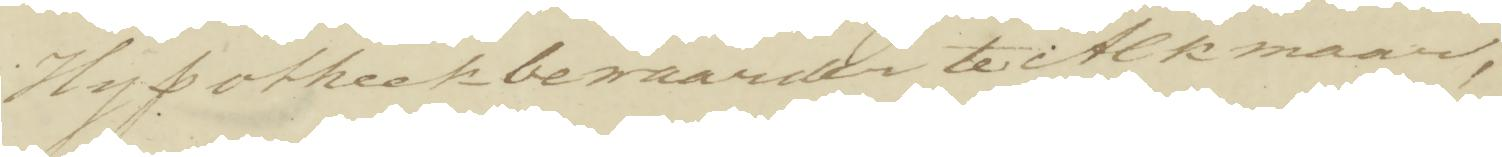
Hypotheekbewaarder te Alkmaar,
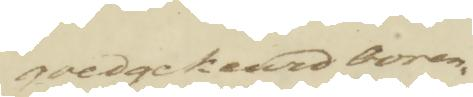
goedgekeurd boven,
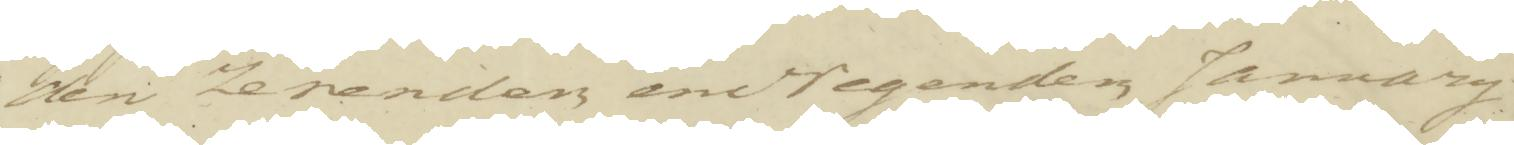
den Zevenden en Negenden January
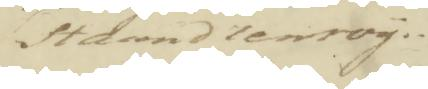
staand renvoij.
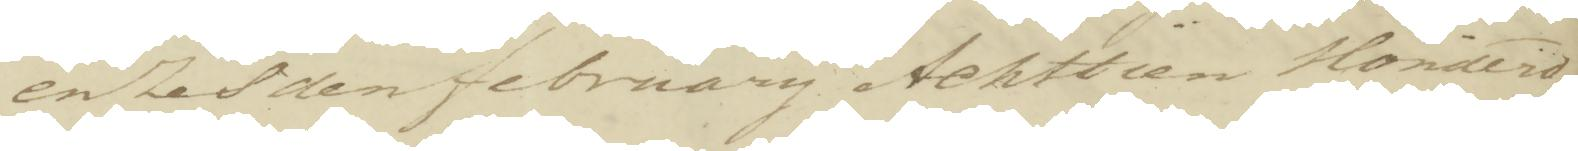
en Zesden februarij Achttien Honderd
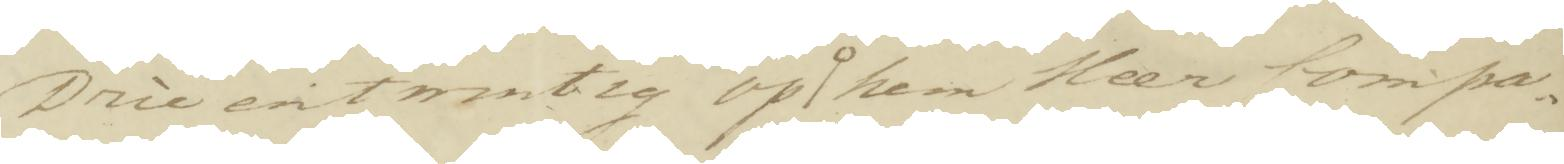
Drie en twintig op ¶ hem Heer Compa„
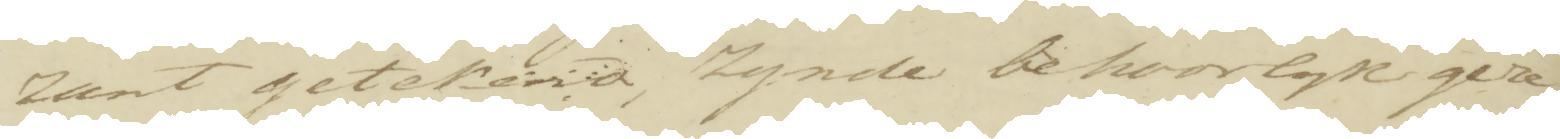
rant getekend, zynde behoorlijk gere
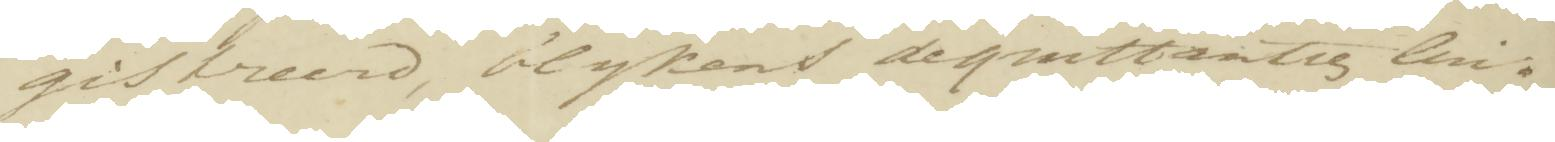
gistreerd, blykens de quittantie lui„
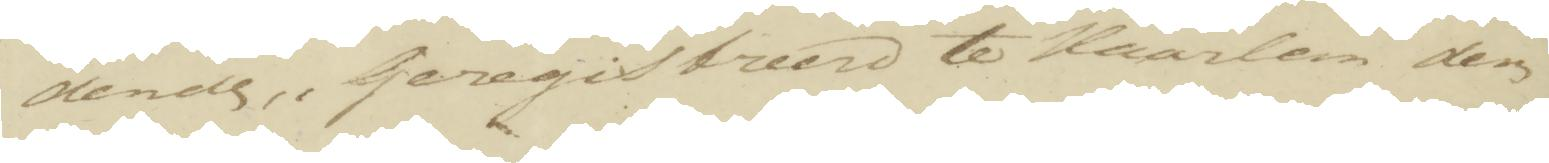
dende,, Geregistreerd te Haarlem den
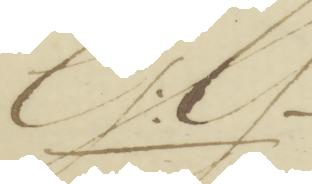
G:G-
